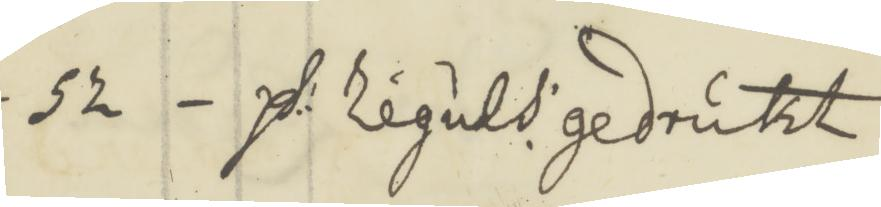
52 — ps: reguls: gedrukt
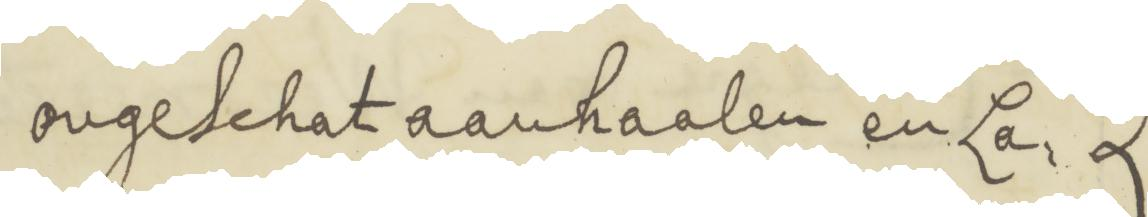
ongeschat aanhaalen en La
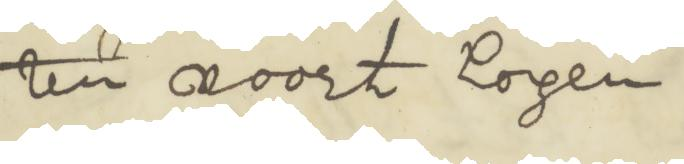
ten voort Lopen
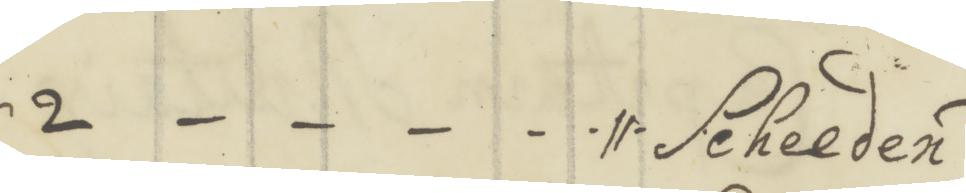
2 — — — — - - „- scheeden
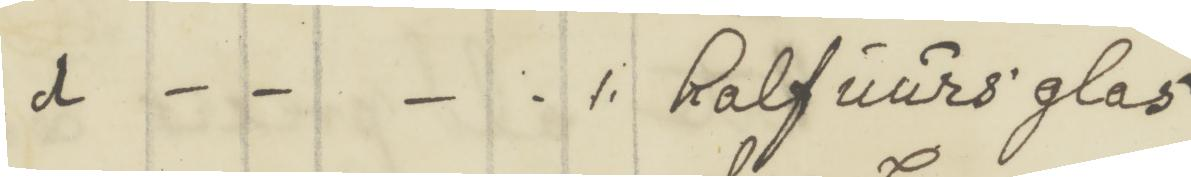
1 — — — — - „ half uurs glas
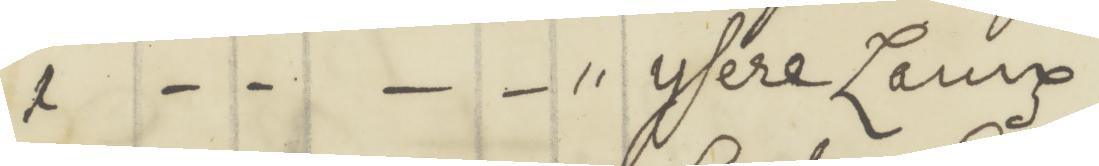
2 — — — — „ ysere Lamp
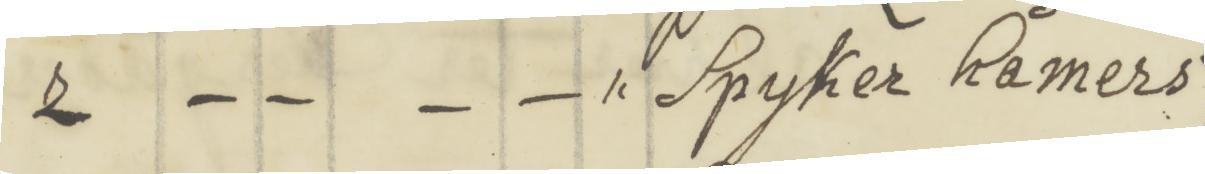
2 — — — — „ spyker hamers
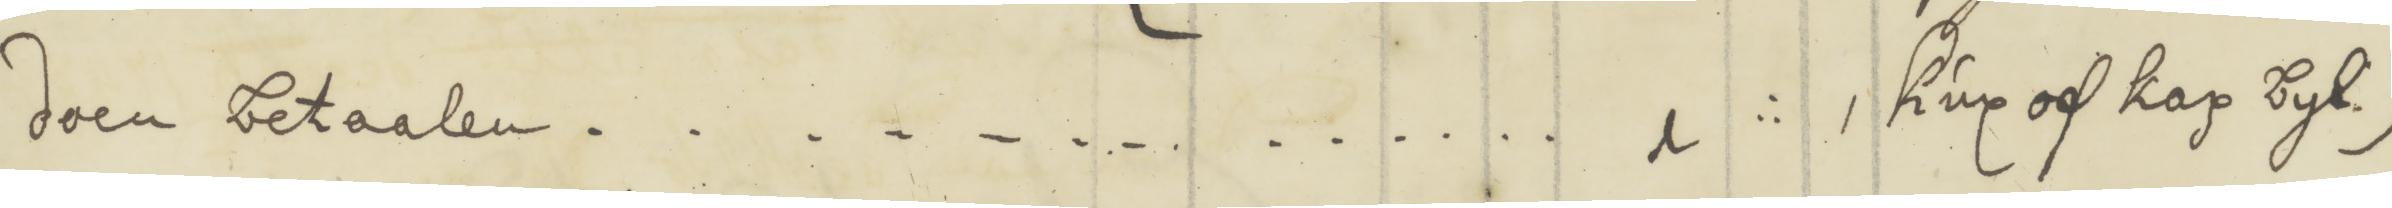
doen betaalen - - - - — - . - . - - . . . . d . : , kux of kop byl:
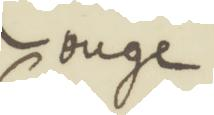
onge
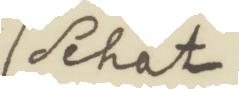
schat
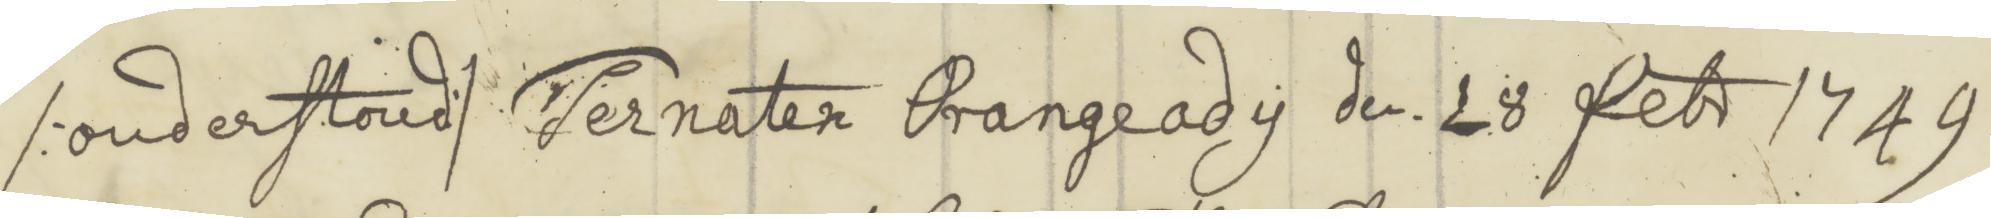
/:onderstond:/ Ternaten Orange adij den 28 feb 1749
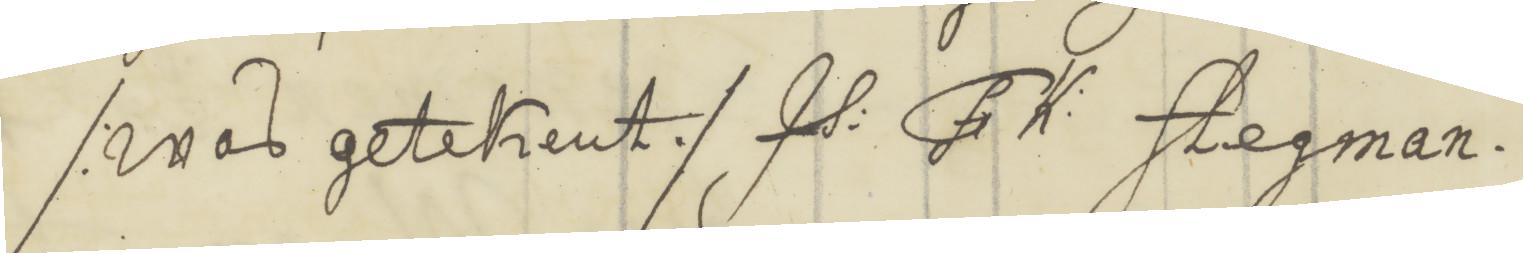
/:was getekent:/ Js: C F K: Stegman.
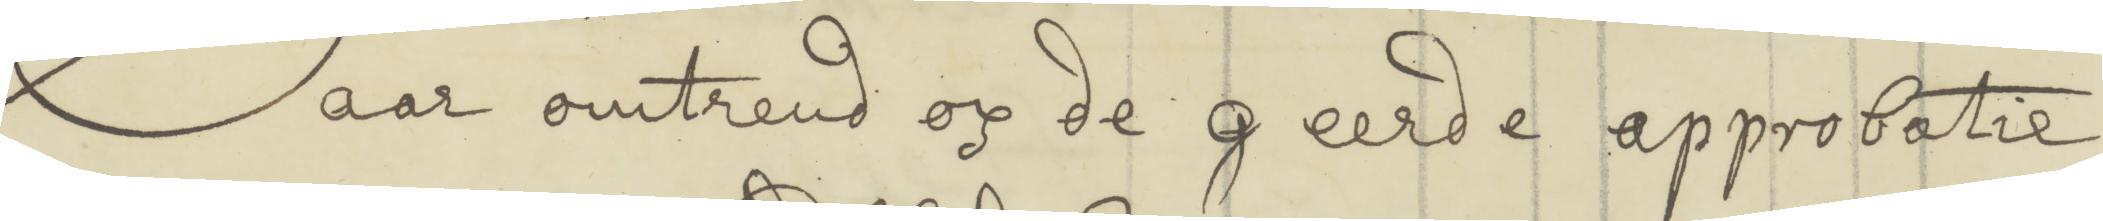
Daar omtrend op de g eerde approbatie
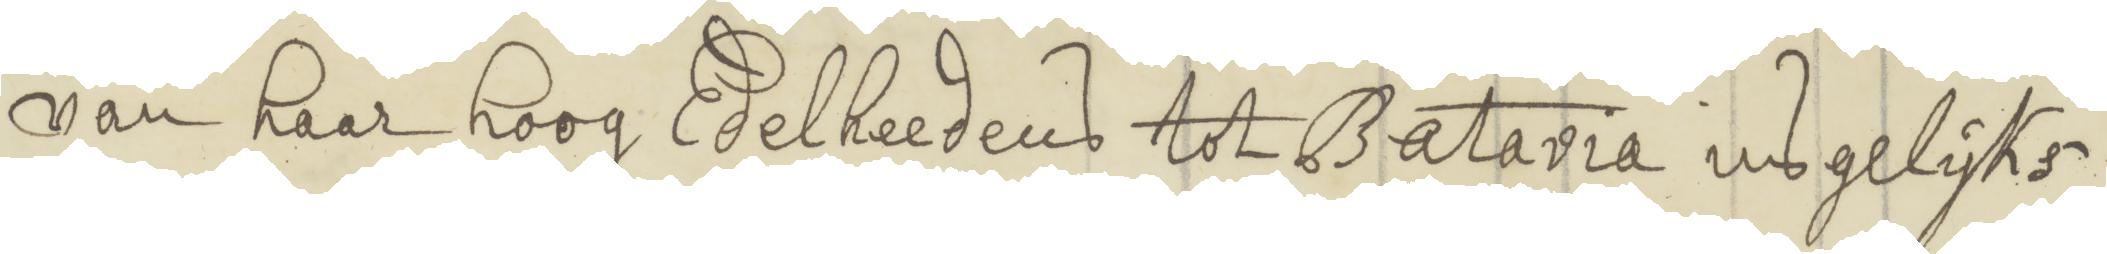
van haar hoog Edelheedens tot Batavia ins gelijks
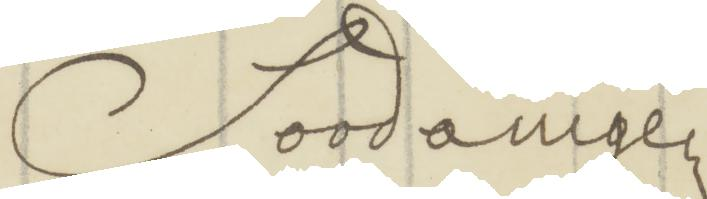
Soodanigen
